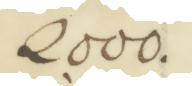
2000.
